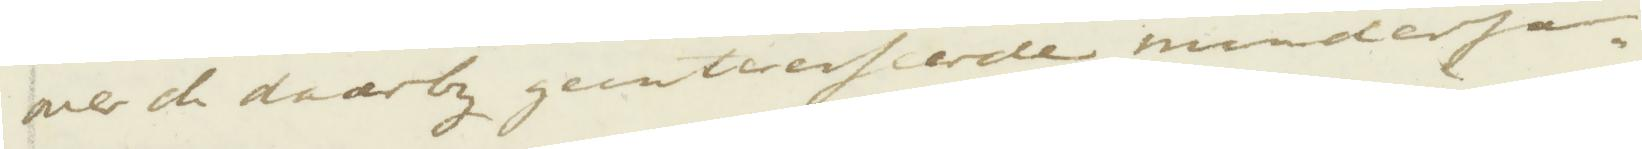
over de daarby geinteresseerde minderja„
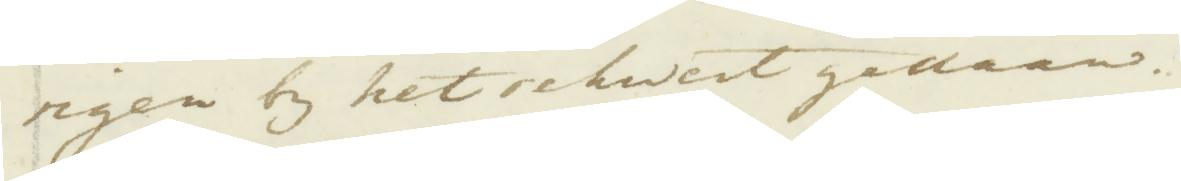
rigen bij het rekwest gedaan.
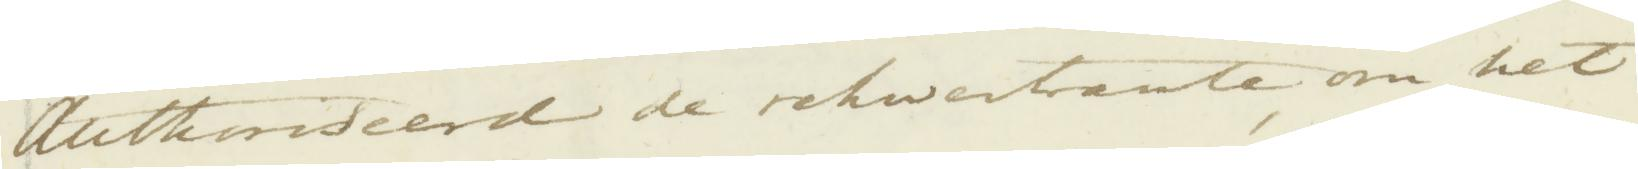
Authoriseerd de rekwestrante, om het
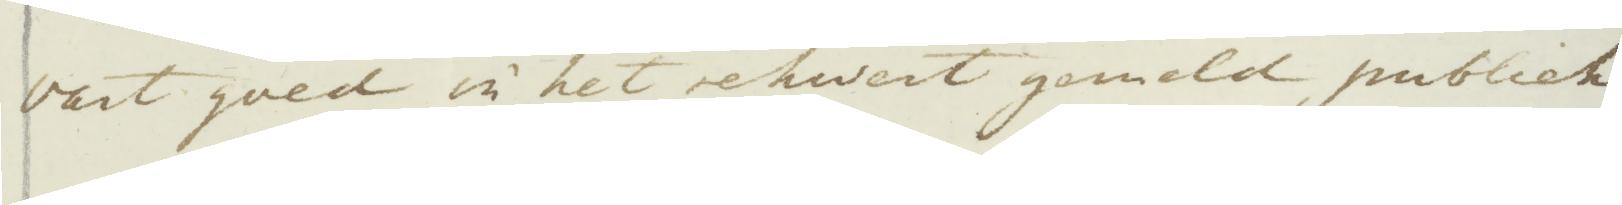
vast goed in het rekwest gemeld, publiek
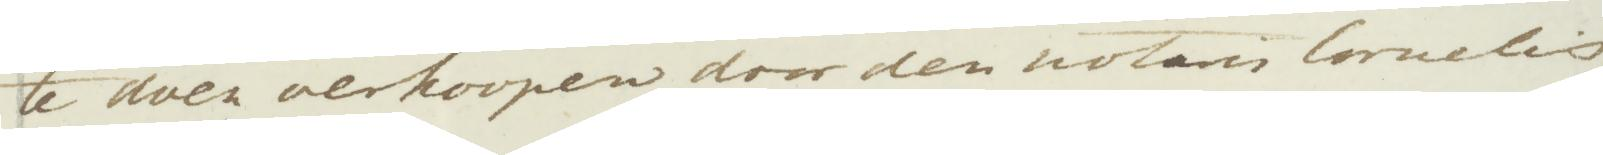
te doen verkoopen door den notaris Cornelis
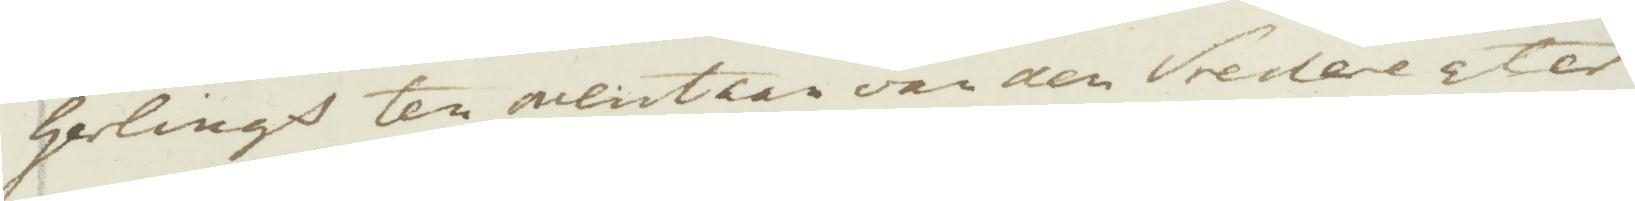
Gerlings, ten overstaan van den Vrederegter
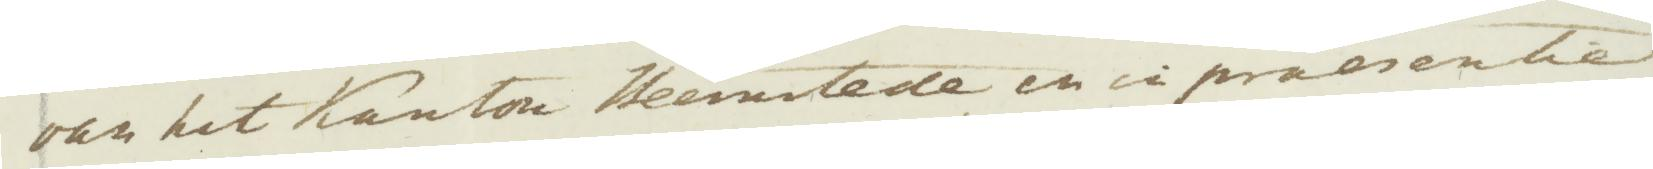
van het Kanton Heemstede en in praesentie
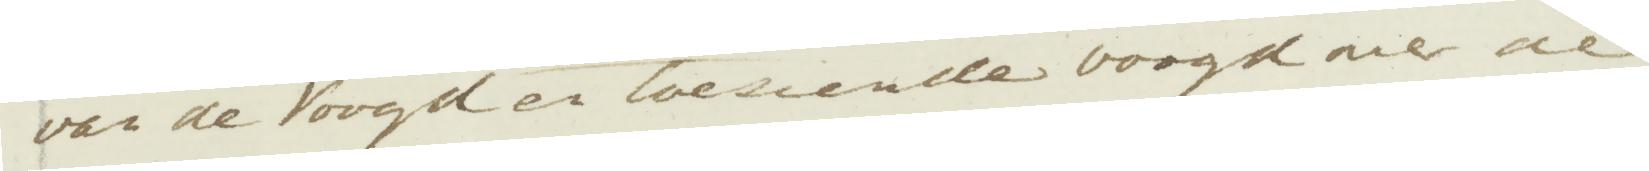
van de Voogd en toeziende voogd over de
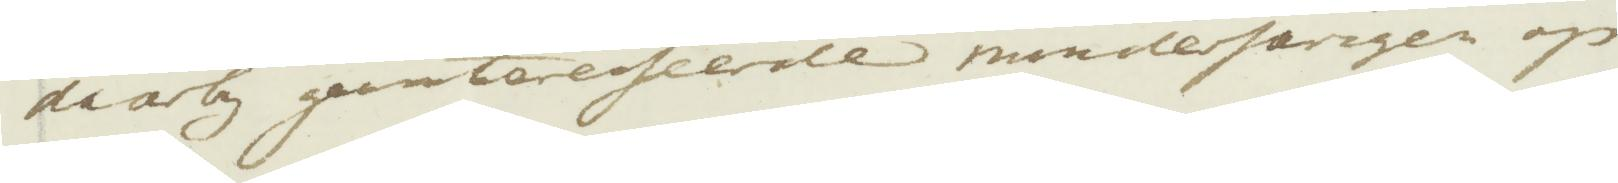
daarby geinteresseerde minderjarigen op
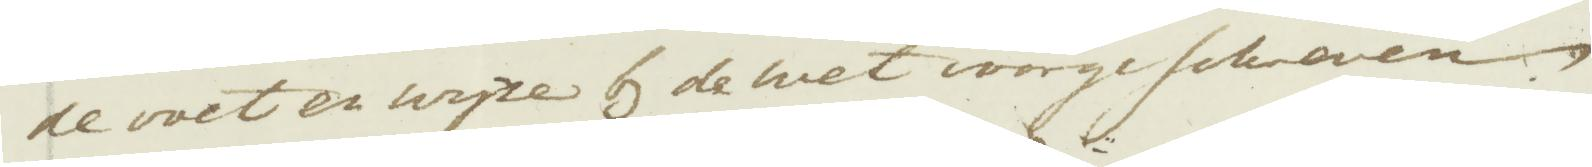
de voet en wyze de wet voorgeschreven.
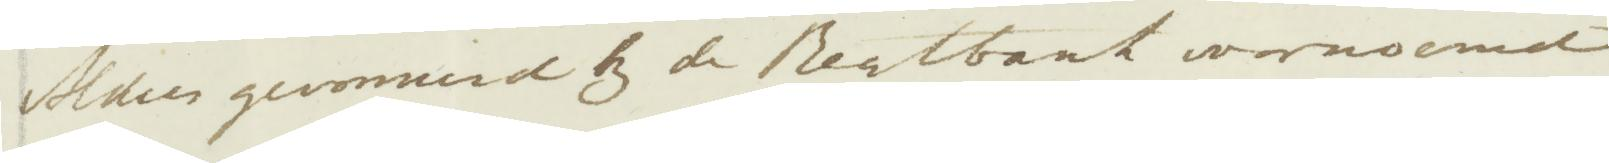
Aldus gesommeerd by de Regtbank voornoemd
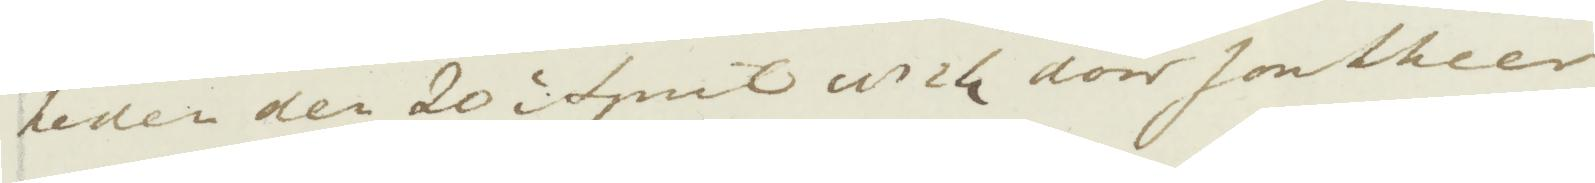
heden den 20' April 1824 door Jonkheer,
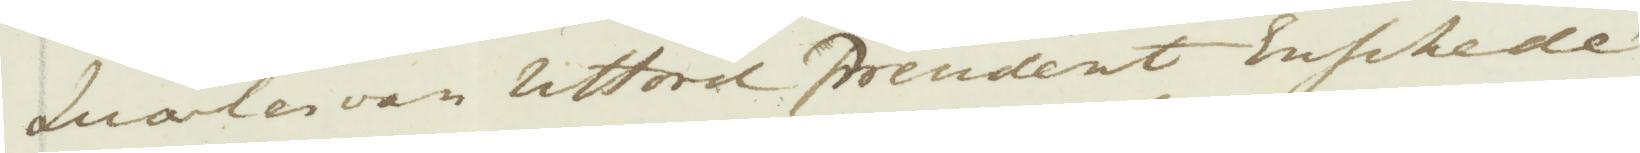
Quarles van ufford President, Enschede
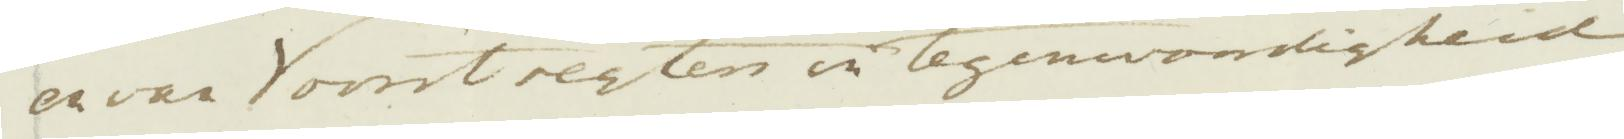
en van Voorst regten in tegenwoordigheid
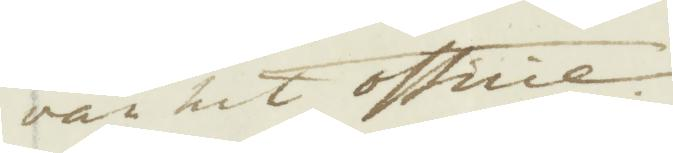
van het office.
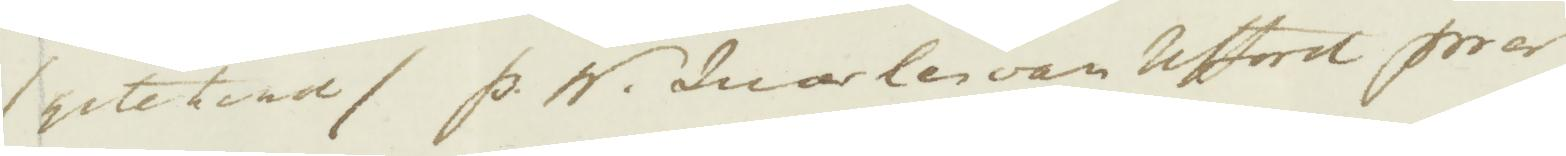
/getekend / p. w. Quarles van ufford presi
